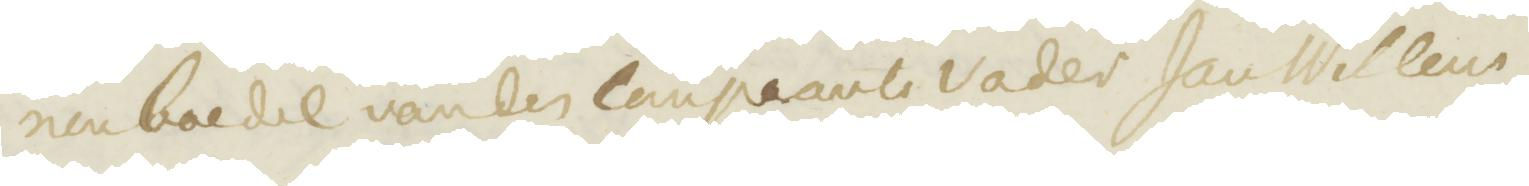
nen boedel van den Comparants Vader Jan Willem
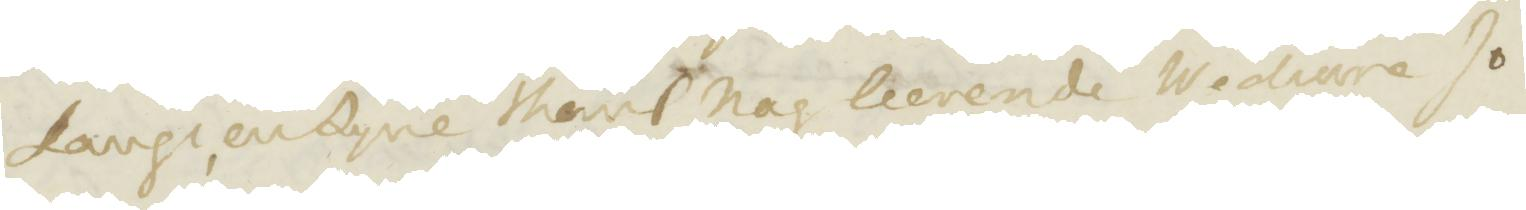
Lange, en Zyne thans nog leevende Weduwe Jo
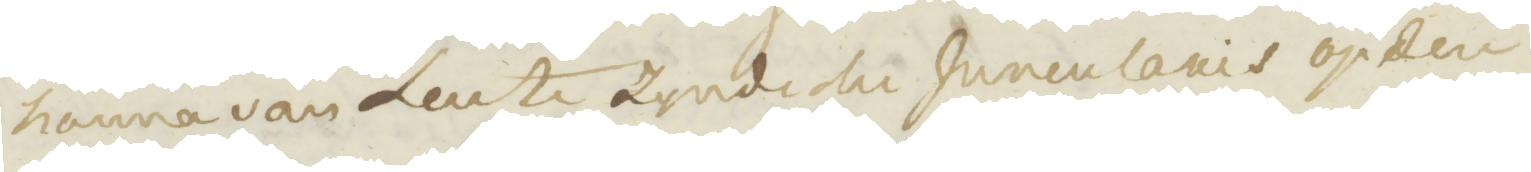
hanna van Lente, zynde de Inventaris op den
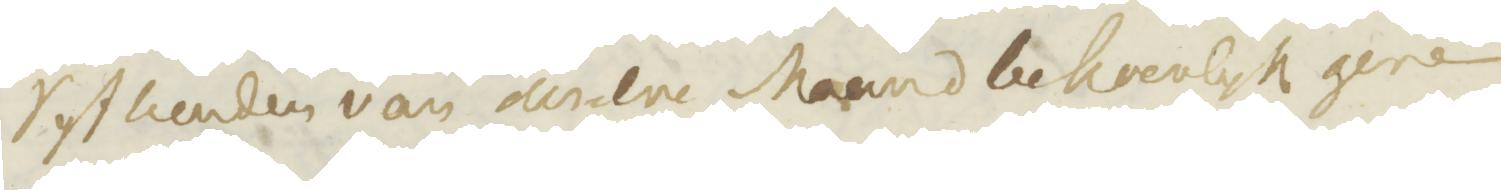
Vijftienden van deselve maand behoorlijk gere
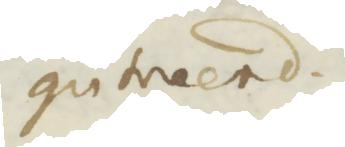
gistreerd.
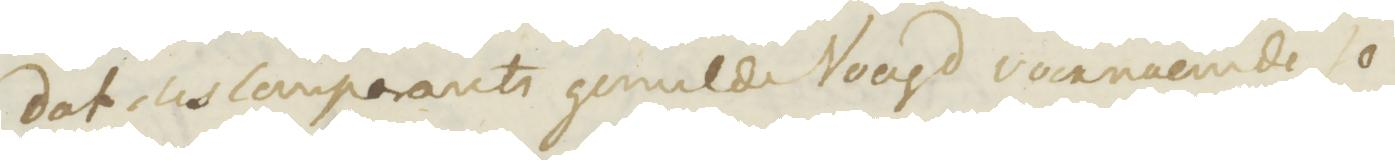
dat des Comparants gemelde Voogd voornoemde Jo
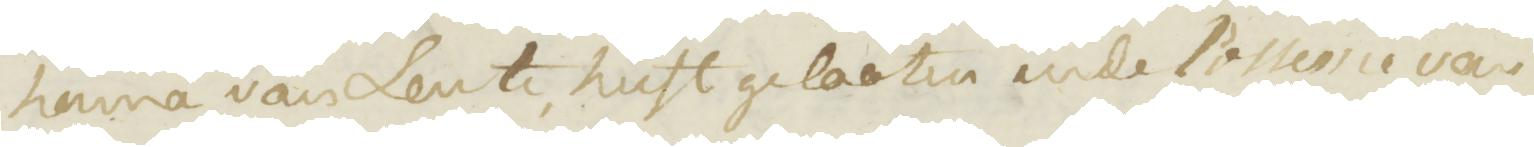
hanna van Lente, heeft gelaaten in de Possessie van
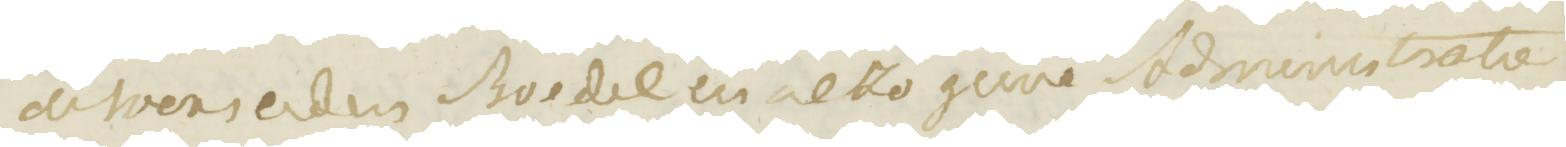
de verseiden Boedel, en alzo geene Administratie
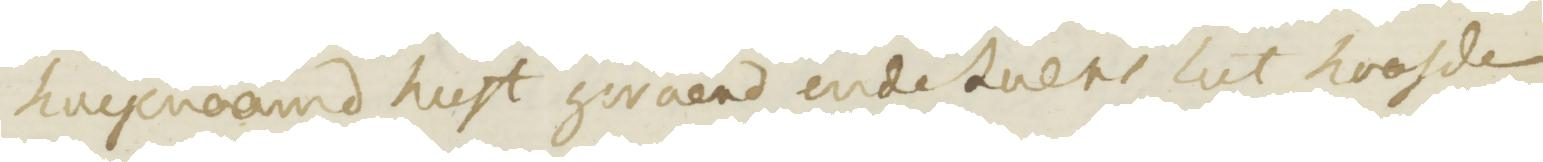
hoegenaamd heeft gevoerd, ende zulks uit hoofde
